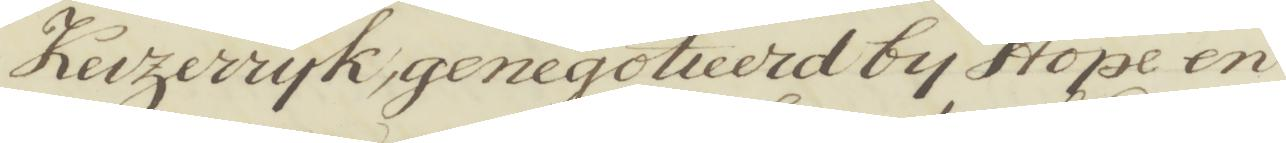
Keizerryk, genegotieerd by Hope en
